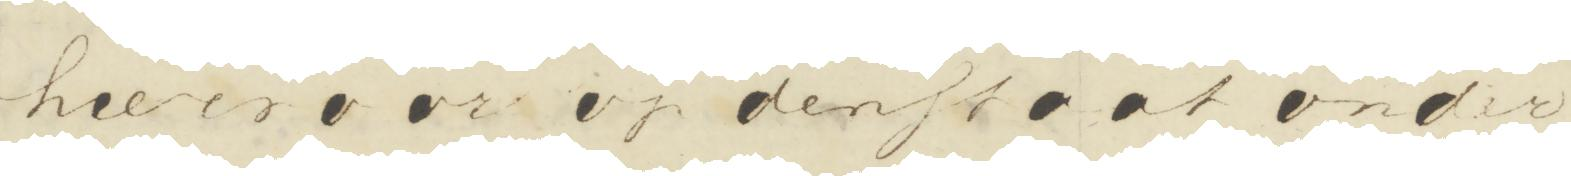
hiervoor op den staat onder
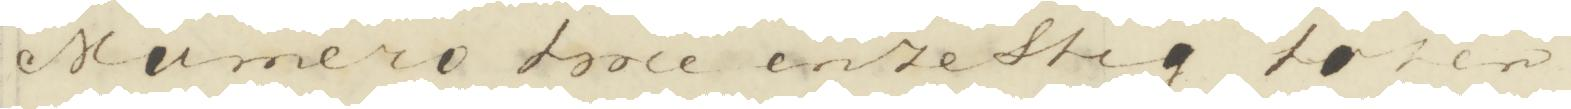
Numero twee en zestig tot en
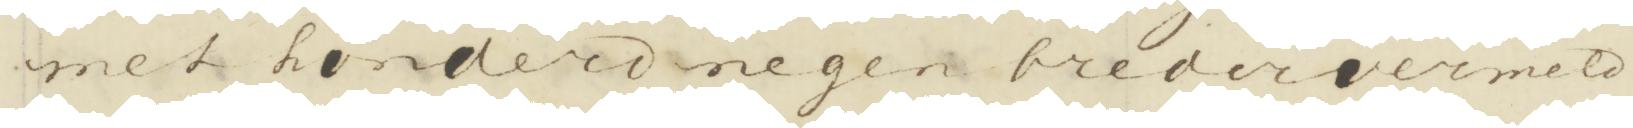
met honderd negen breder vermeld
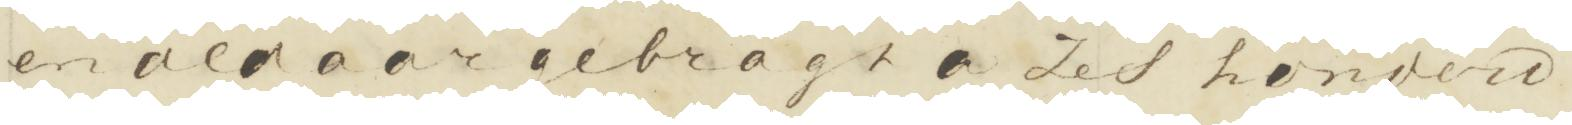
en aldaar gebragt a zes honderd
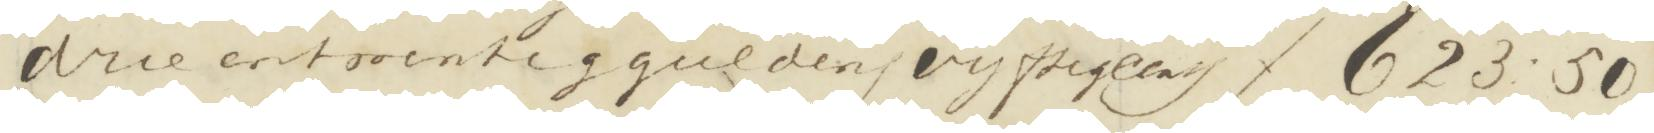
drie en twintig guldens vyftig cents ƒ 623: 50
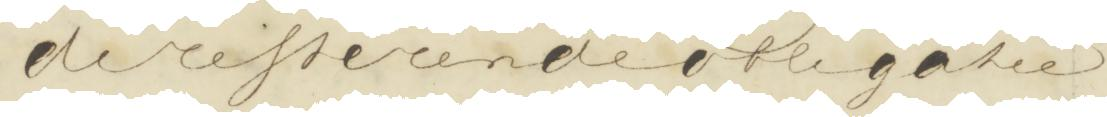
de resterende obligatie
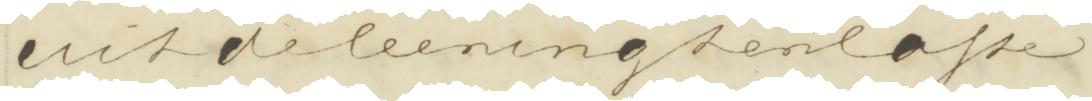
uit de leening ten laste
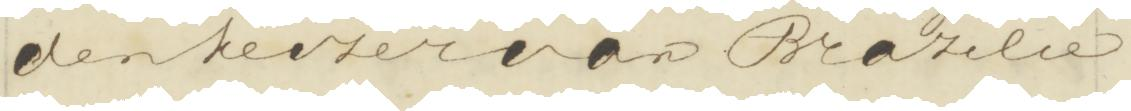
den keizer van Brazilie
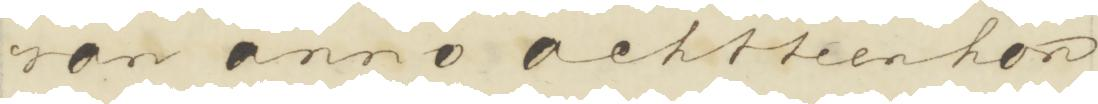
van anno achttienhon
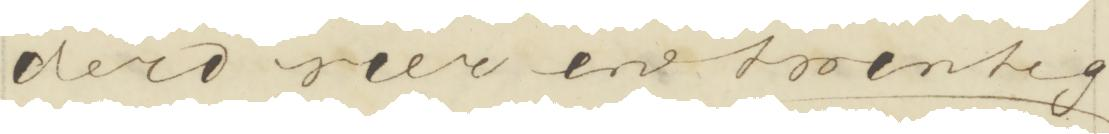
derd vier en twintig
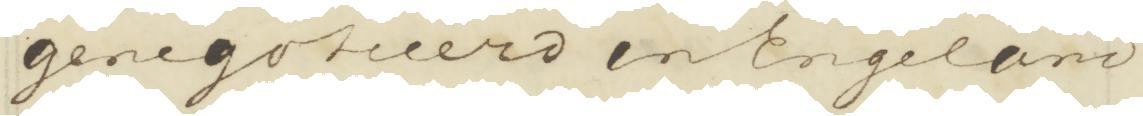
genegotieerd in Engeland
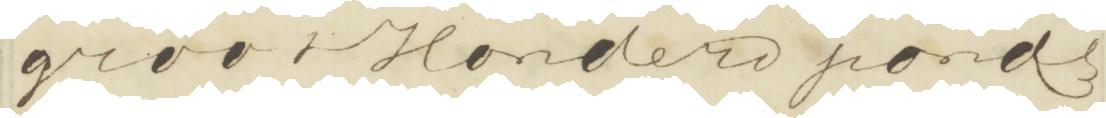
groot Honderd pond
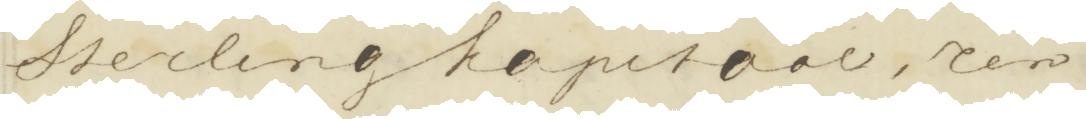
sterling kapitaal, ren
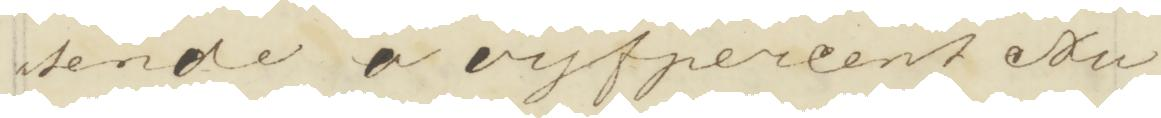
tende a vyf percent Nu
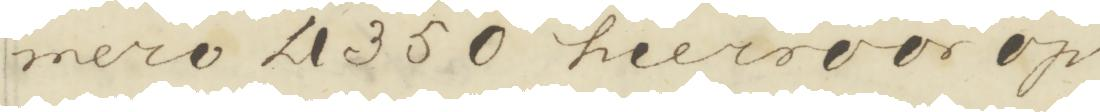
mero 4350 hiervoor op
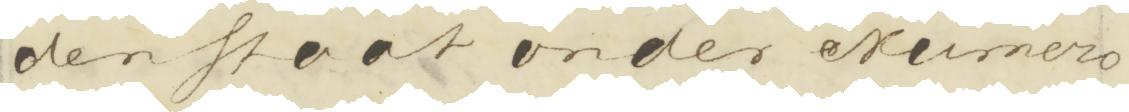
den staat onder Numero
